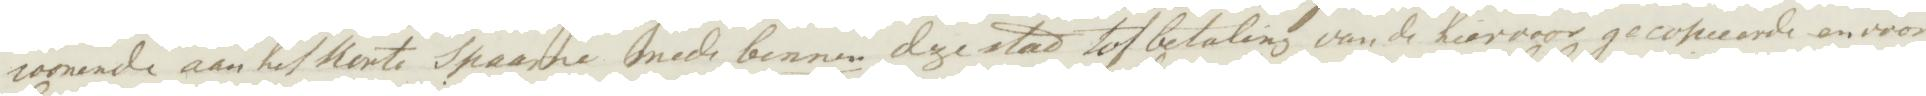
wonende aan het Korte spaarne mede binnen deze stad tot betaling van de hiervoor gecopieerde en voor
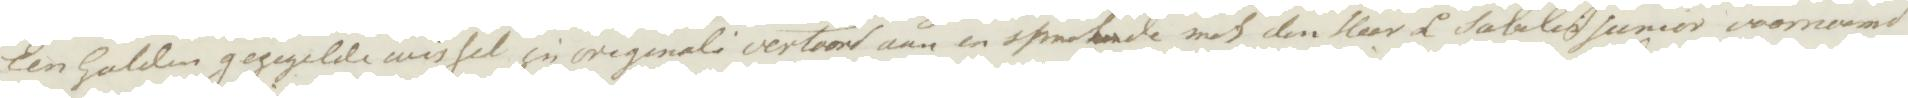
Een Gulden gezegelde wissel in originali vertoond aan en sprekende met den Heer L Sabelis junior voornoemd
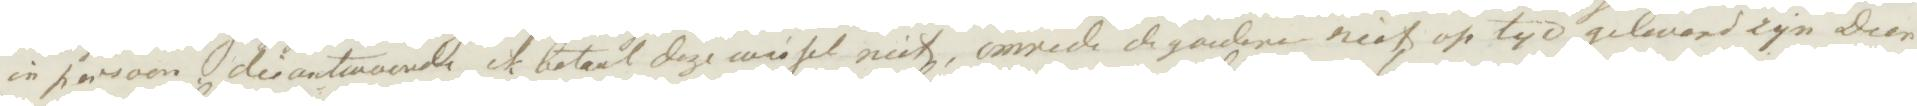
in persoon, die antwoorde ik betaal deze wissel niet, omrede de goederen niet op tyd geleverd zijn Dien
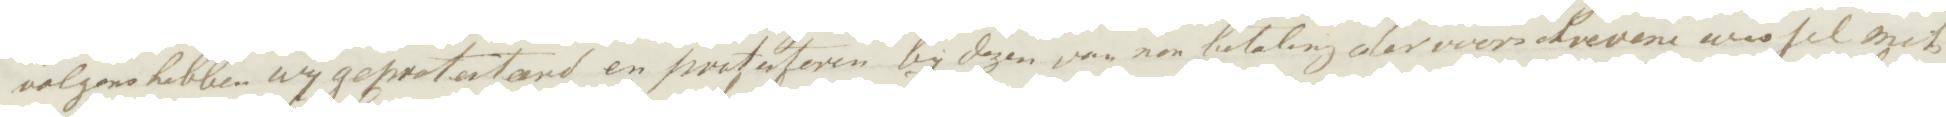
volgens hebben wij geprotesteerd en protesteren bij dezen van non betaling der voorschrevene wissel mits
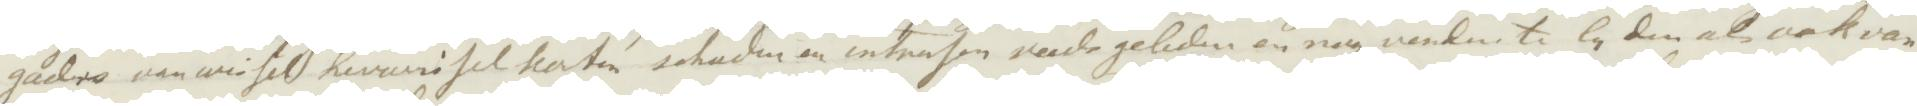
gaders van wissel herwissel kosten schaden en intressen reeds geleden en nog verder te lyden als ook van
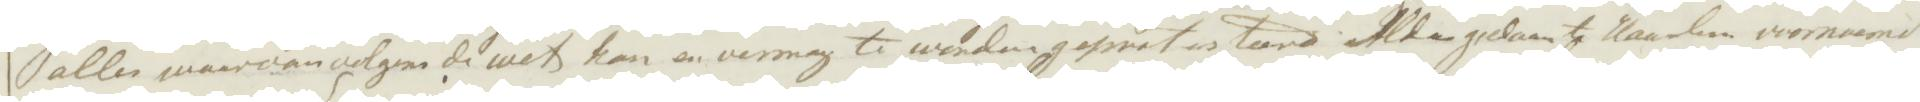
alles waarvan volgens de wet kan en vermag te worden geprotesteerd Aldus gedaan te Haarlem voornoemd
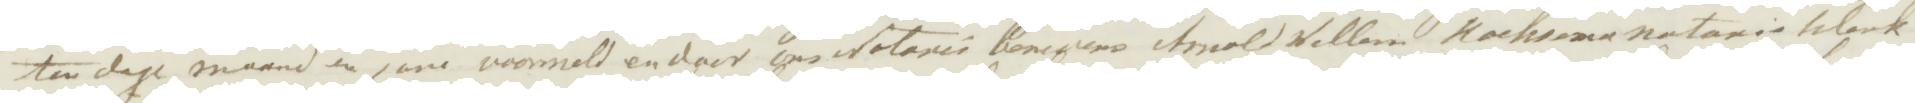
ten dage maand en jare voormeld en door ons Notaris benevens Arnold Willem Haeksema notaris klerk
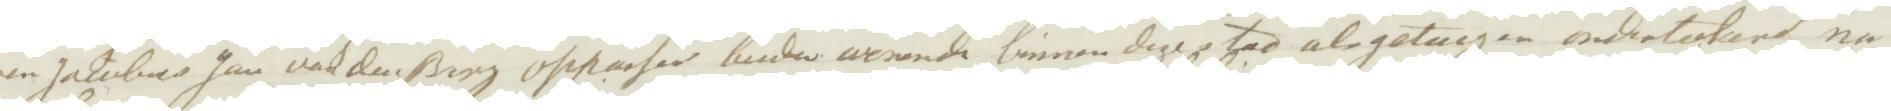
en Jacobus Jan van den Berg oppasser beiden wonende binnen deze stad als getuigen onderteekend na
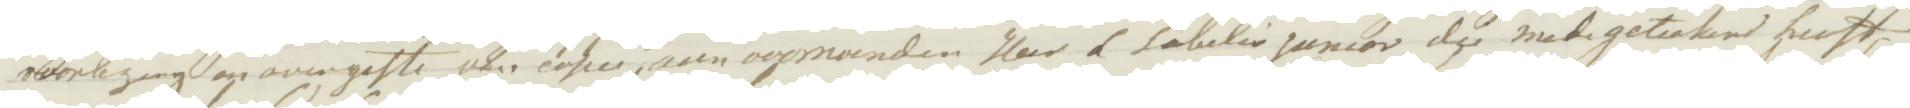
voorlezing op overgifte van copie aan voornoemden Heer L. Sabelis junior die mede geteekend heeft.
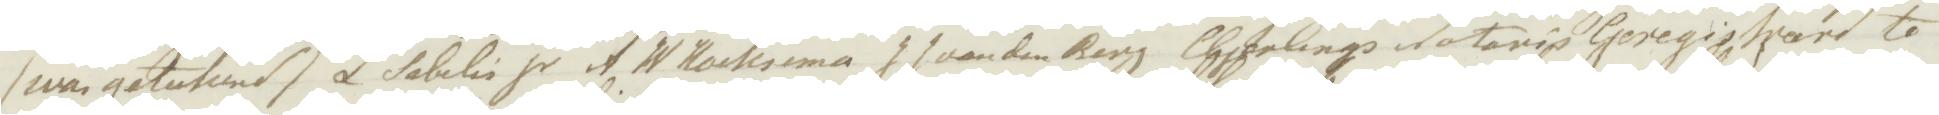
(was geteekend) L Sabelis jr A W Haeksema J J van den Berg C Gerlings Notaris Geregistreerd te
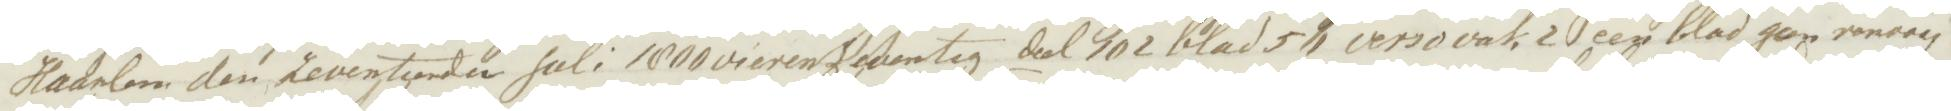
Haarlem den Zeventienden Juli 1800 vieren zeventig deel 102 blad 56 verso vak 2 een blad geen renvoy
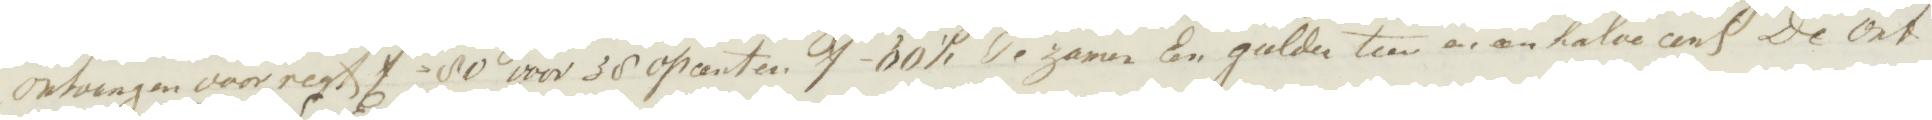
ontvangen voor regt ƒ - 80 voor 38 opcenten ƒ 30½ Te zamen Een gulden tien en een halve cent De Ont
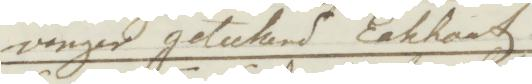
vanger geteekend Eekhout
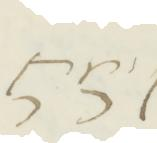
5517
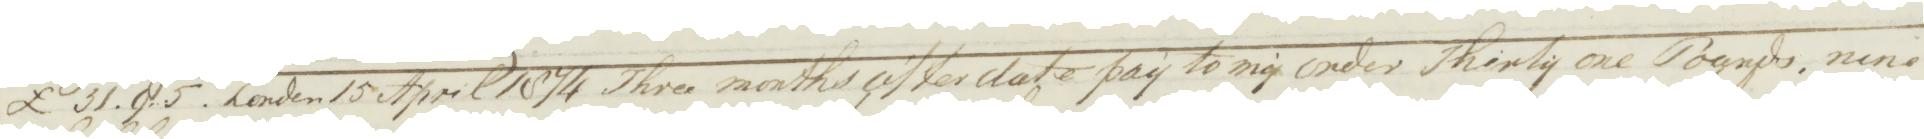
£ 31.9.5. Londen 15 April 1874 Three months after date paij to mij order Thirtij one Pounds, nine
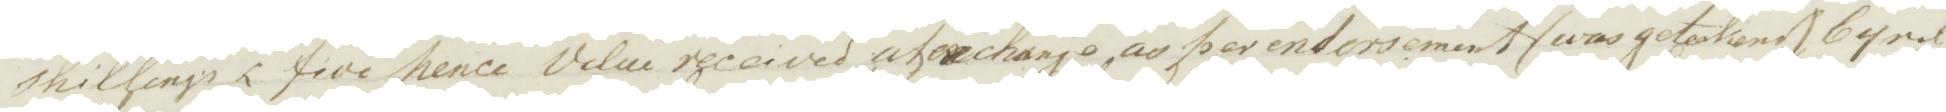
shillings & five pence Value received at exchange as per endorsement (was geteekend) Cyril
